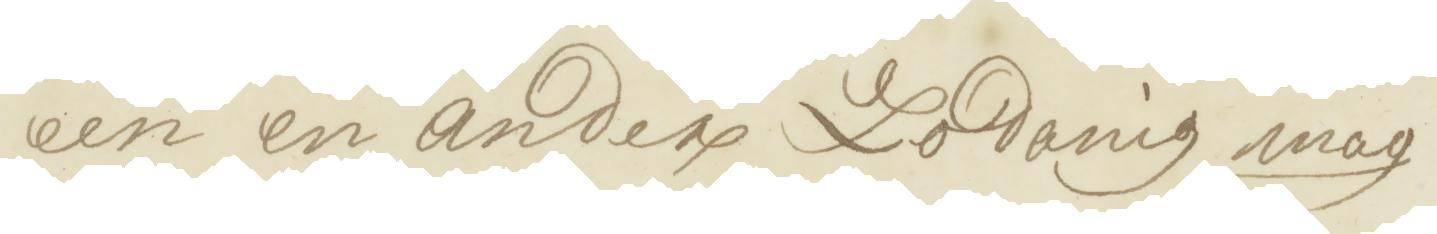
een en ander zodanig mag
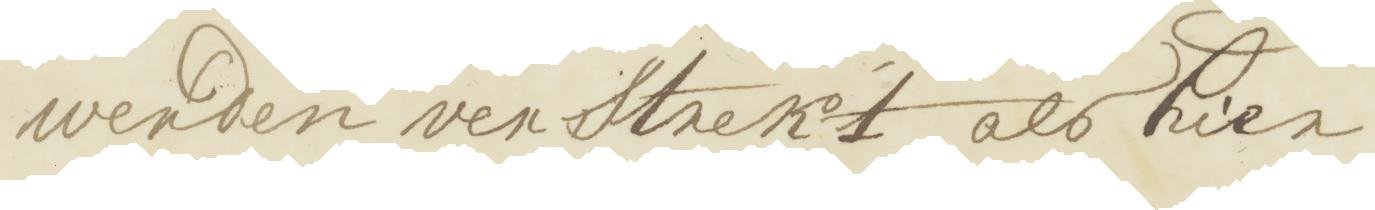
werden verstrekt als hier
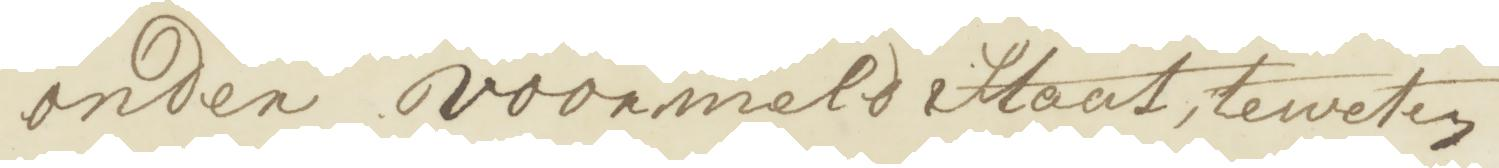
onder voormeld staat, teweten
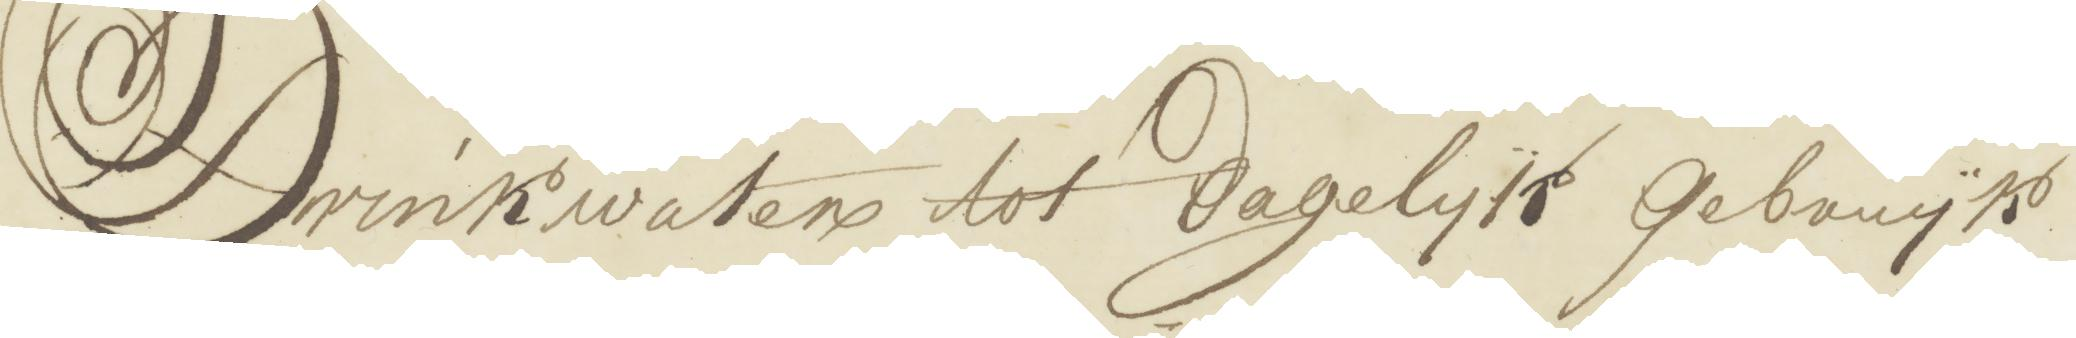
Drinkwater tot dagelijks gebruijk
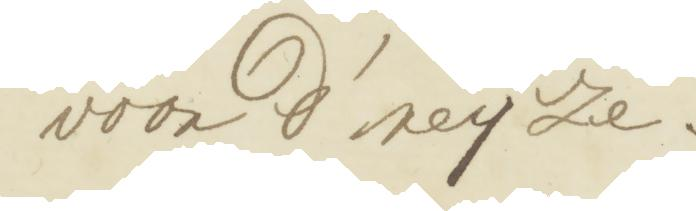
voor d’ reijze.
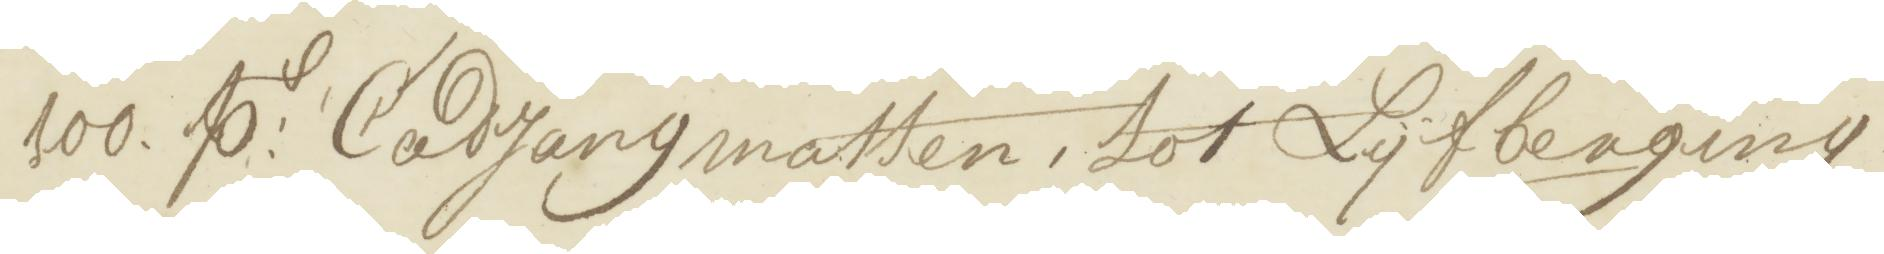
100. p:s Cadjang matten, tot lijfberging
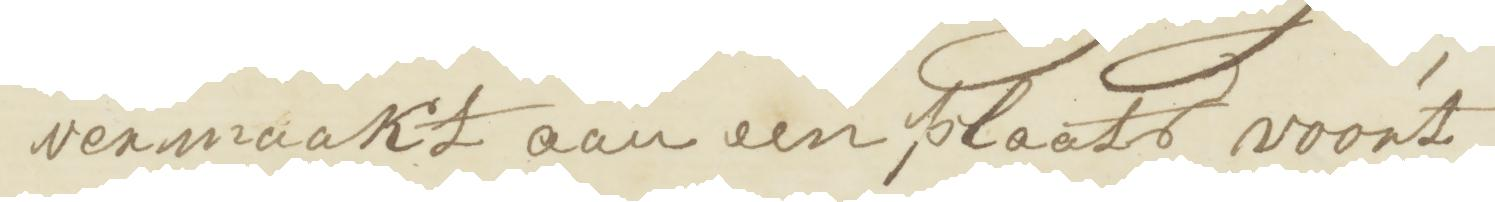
vermaakt aan een plaats voor't
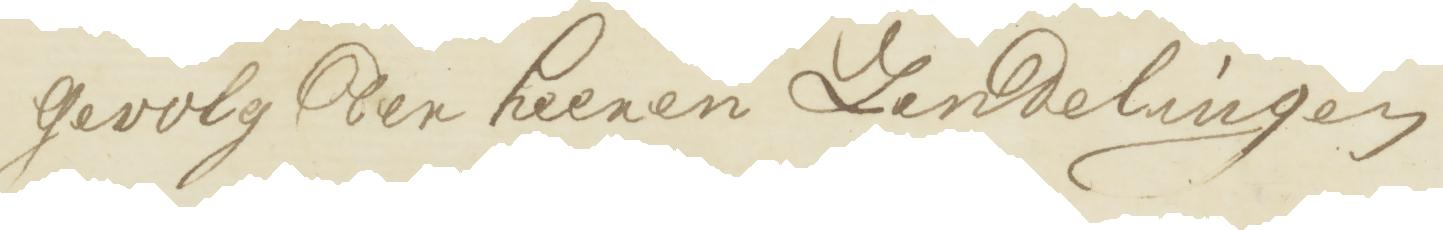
gevolg der heeren zendelingen
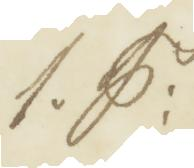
1„ p:s.
